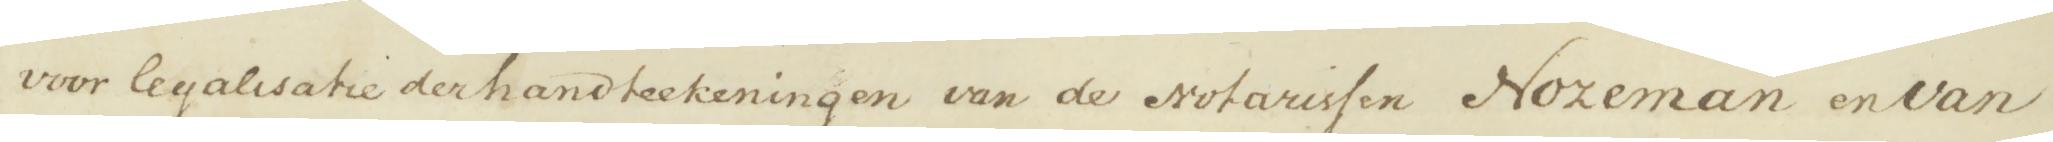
voor legalisatie der handteekeningen van de Notarissen Nozeman en van
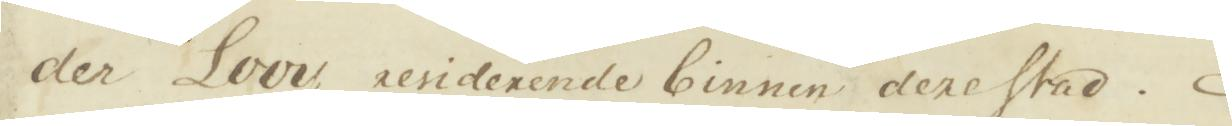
der Looy, residerende binnen deze stad.
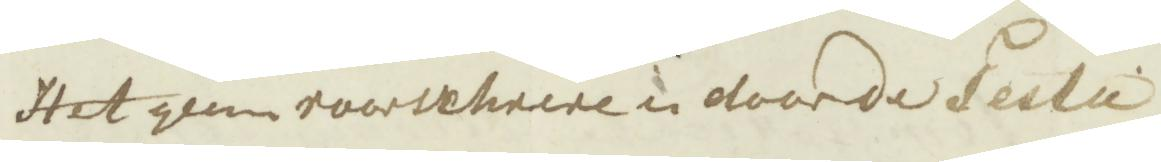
Het geen voorschreve is door de Testa
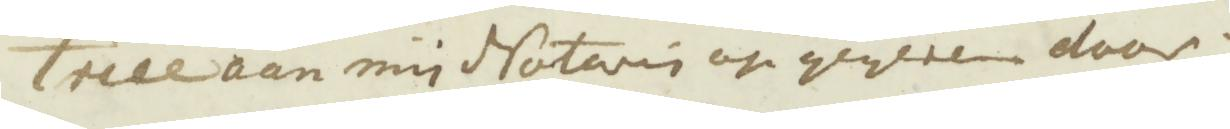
trice aan mij Notaris op gegeven door
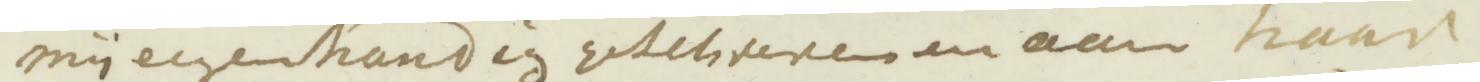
mij eigenhandig geschreven en aan haars
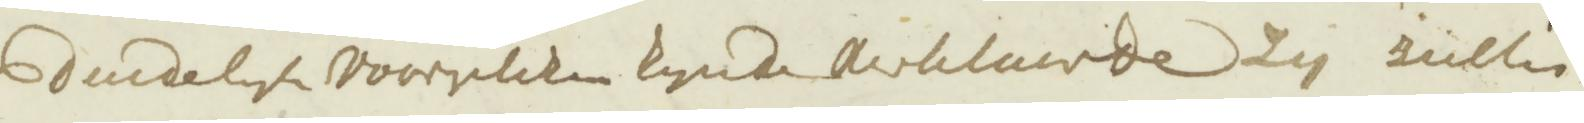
duidelyk voorgelezen zynde verklaarde zy zulks
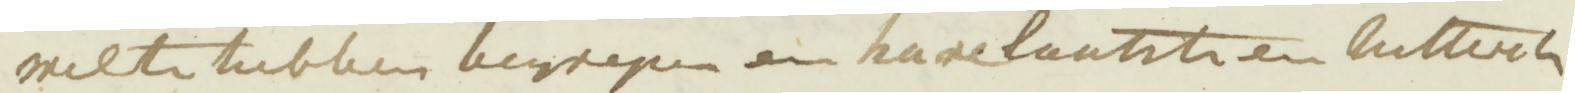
wel te hebben begrepen en hare laatste en uitterste
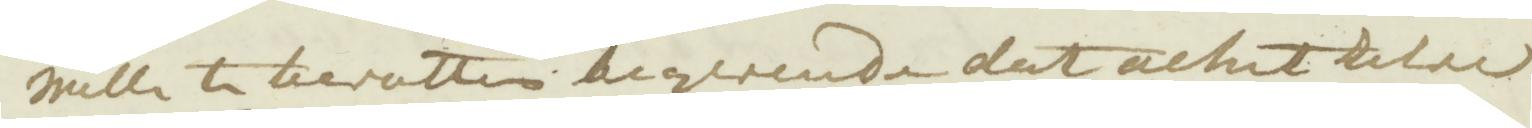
wille te bevatten begerende dat al het zelve
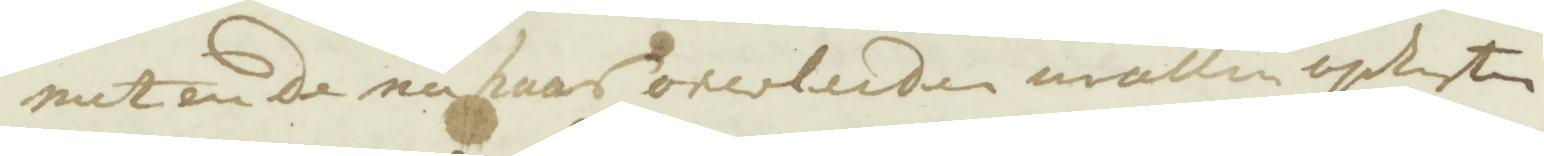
met en de na haar overleiden in allen opzigten
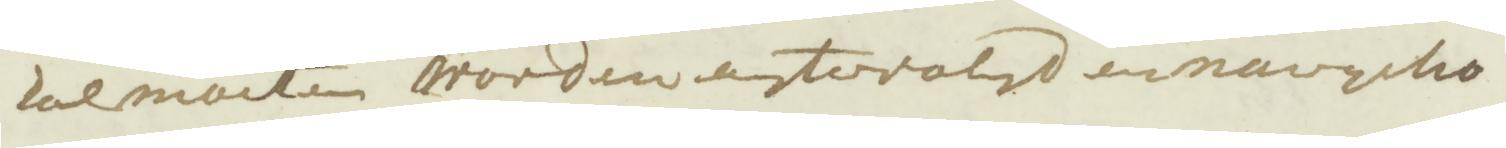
zal moeten worden agtervolgd en naageko
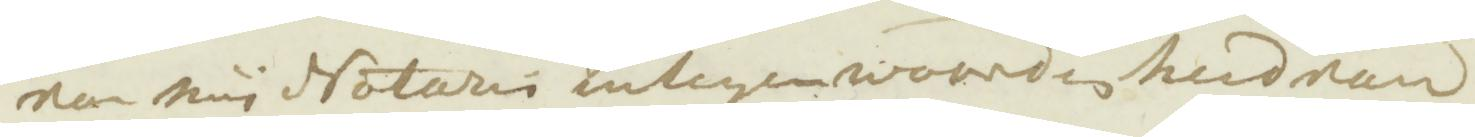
van mij Notaris integenwoordigheid van
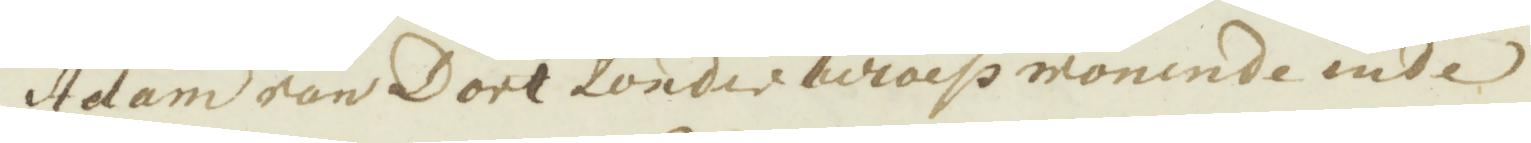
Adam van Dort zonder beroep wonende inde
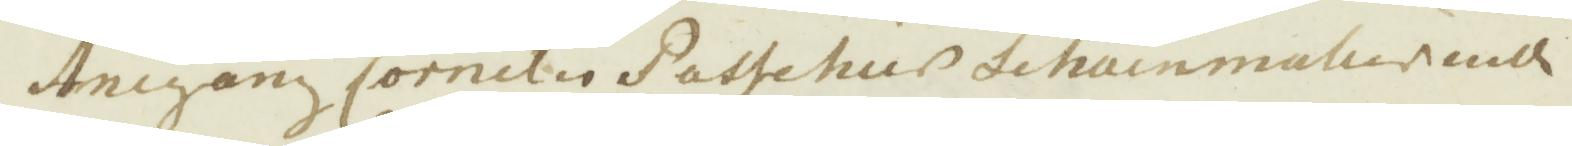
Anegang Cornelis Passchier schoenmaker inde
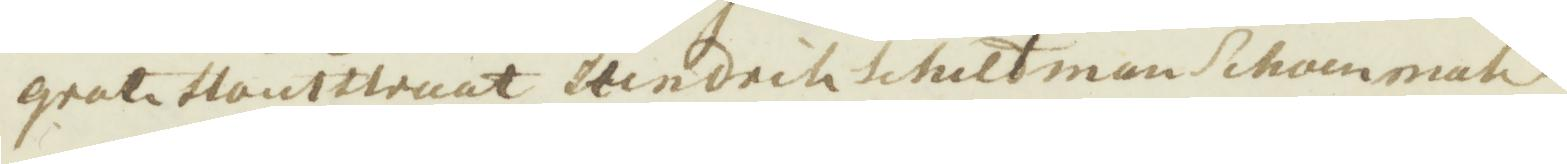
grote Houtstraat Hendrik schiltman Schoenmak
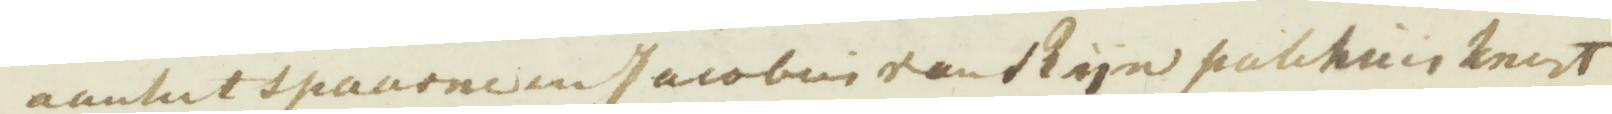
aan het spaarne en Jacobus van Rijn pakhuis knegt
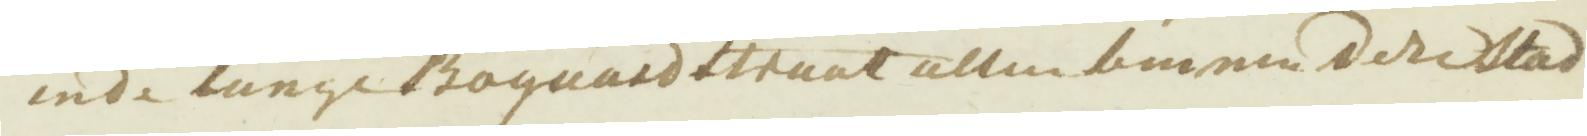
in de lange Bogaardstraat allen binnen deze stad
